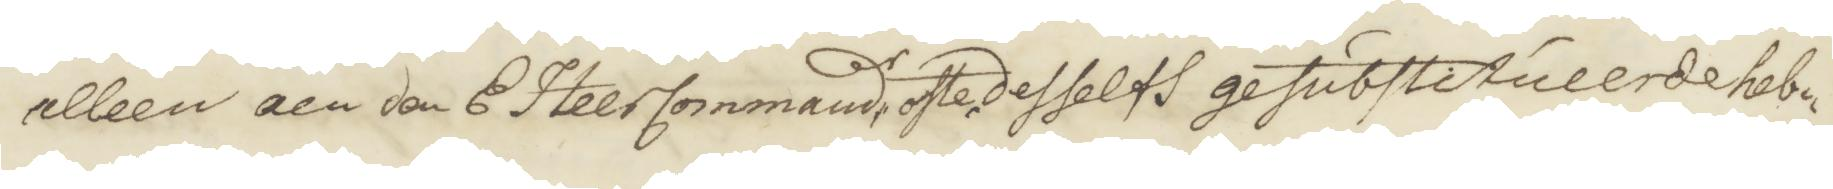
alleen aen den E Heer Command„r ofte ^ desselfs gesubstitueerde heb
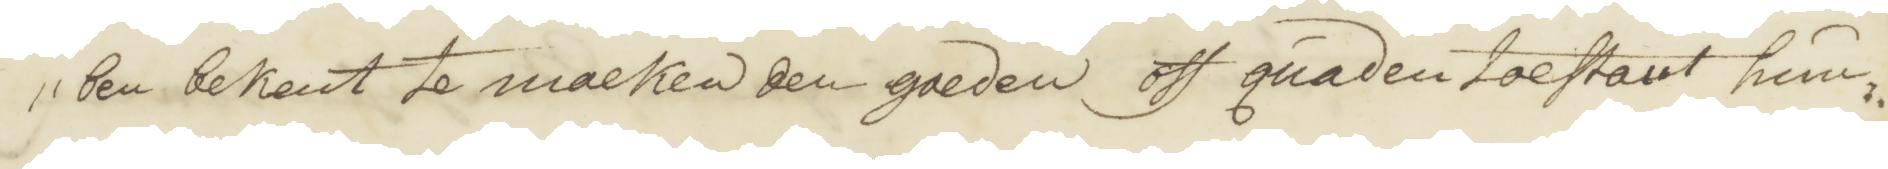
„ben bekent te maeken den goeden off quaden toestant hun„
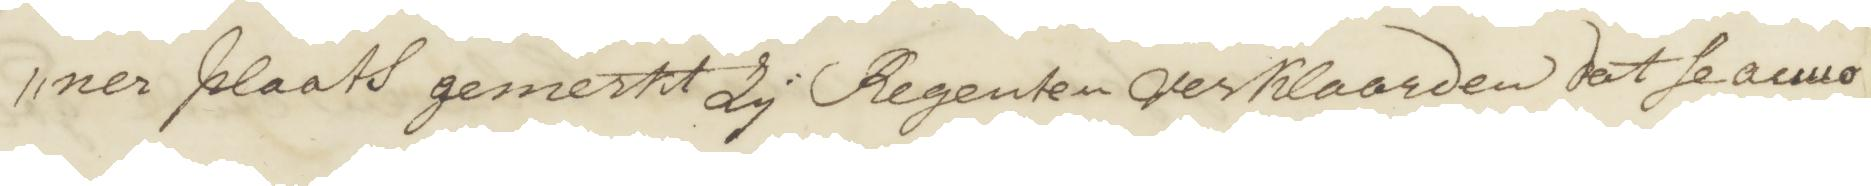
„ner plaats gemerkt zij Regenten verklaarden dat se anno
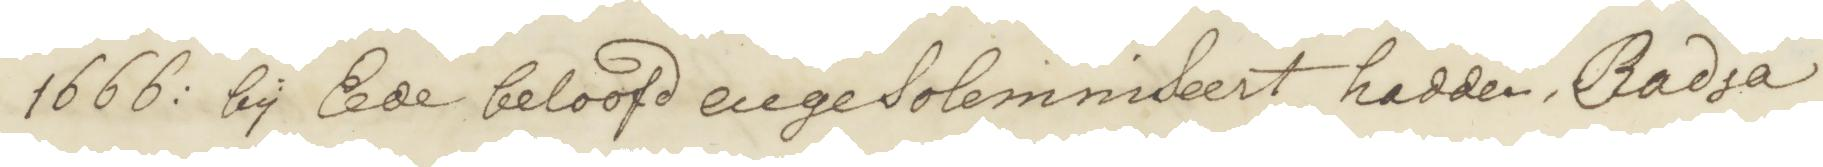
1666: bij Eede beloofd en gesolemniseert hadden, Radja
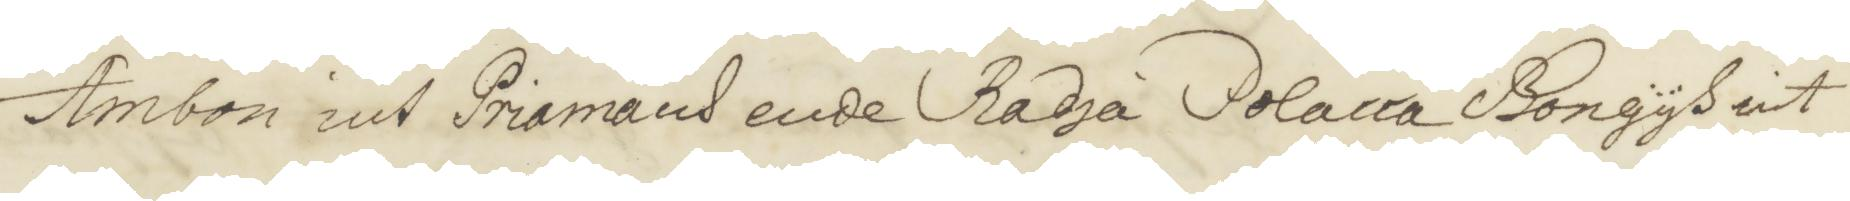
Ambon in 't Priamans ende Radja Polacca Bongijs in ’t
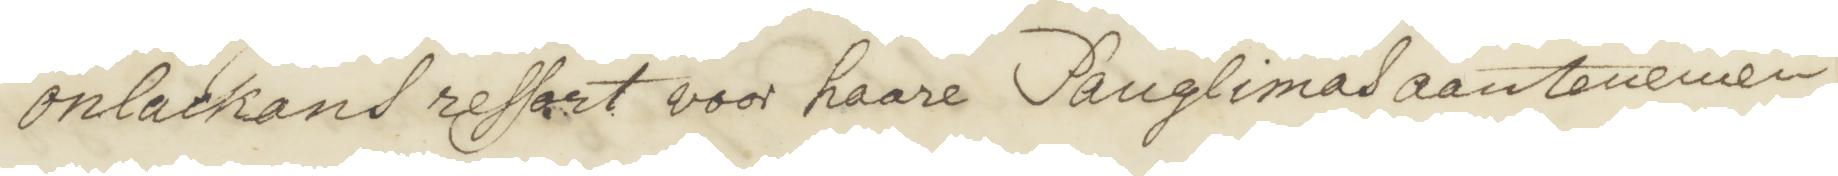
onlackans ressort voor haare Panglimas aan te nemen
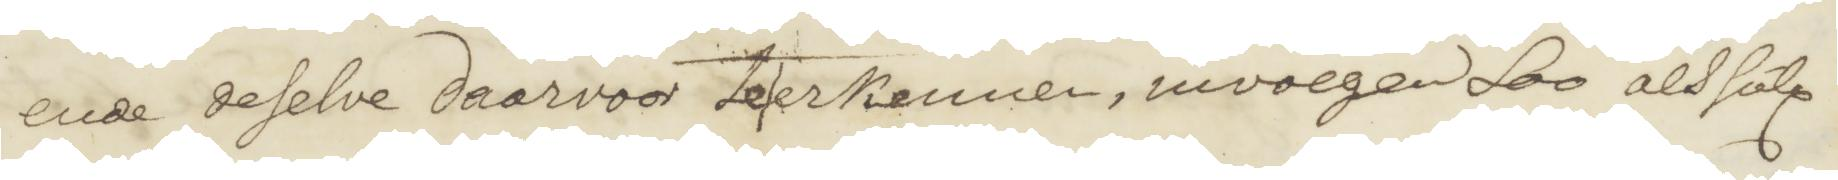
ende deselve daarvoor te erkennen, involgen soo als sulx
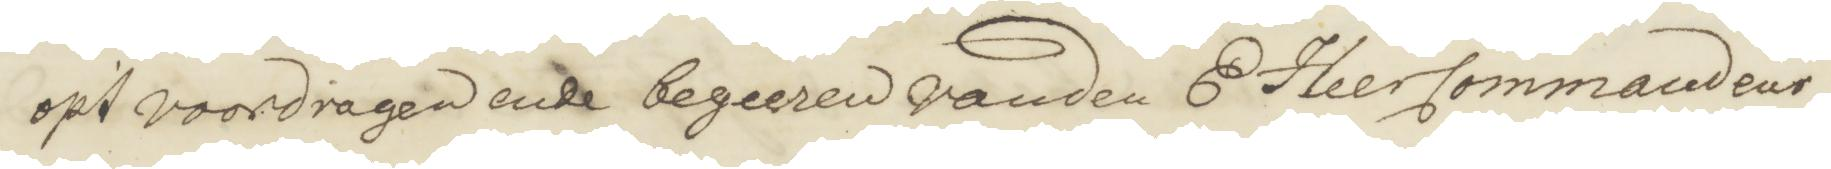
op 't voordragen ende begeeren vanden E Heer Commandeur
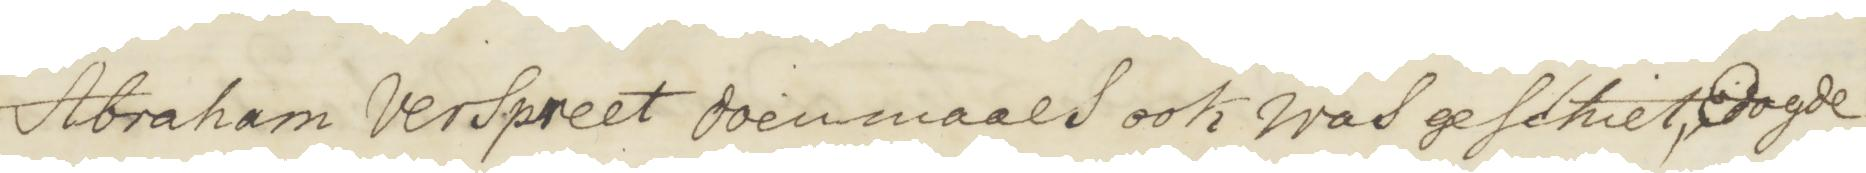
Abraham Verspreet doenmaals ook was geschiet, dog de
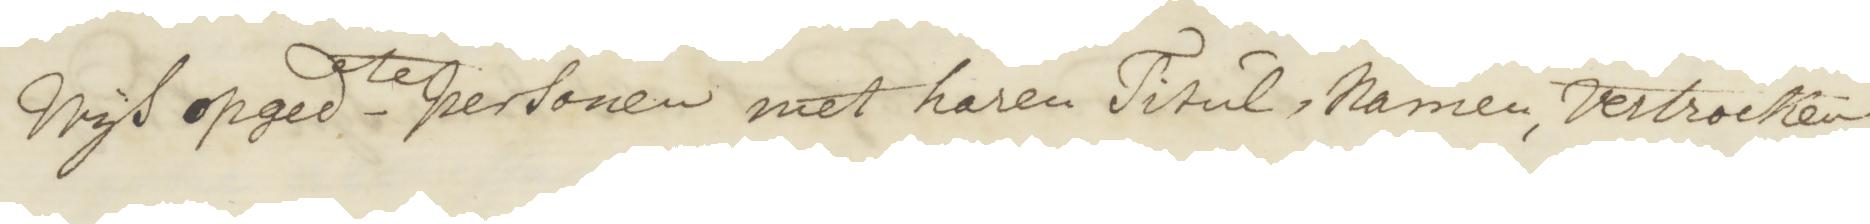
wijs opged-ete personen met haren Titul, Namen, vertrocken,
